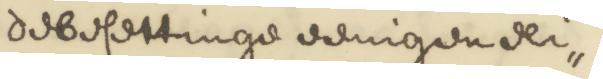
de besettinge eenigen eli„
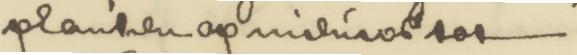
phanten op nieuws tot
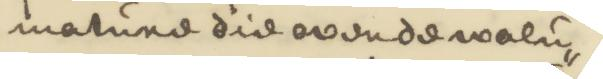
mature die over de walu„
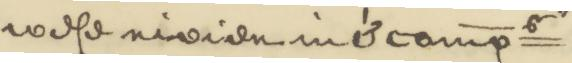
wese rivier in ’s comp=s
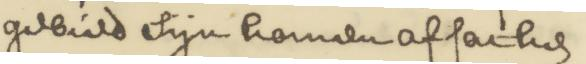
gebied sijn komen afsacken
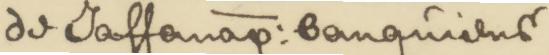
de Iaffanap: banquiers
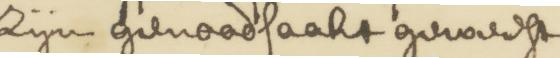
zijn genoodsaakt geweest
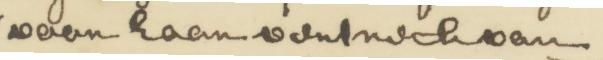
voor haar vertreck van
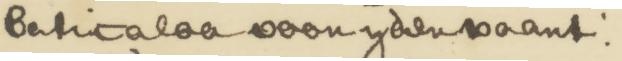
baticaloa voor ijdervaart:
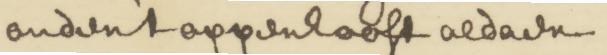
onder ’t opperhooft aldaer
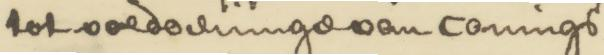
tot voldoeninge van conings
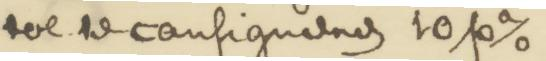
tol te consigneren 10 p a/o
